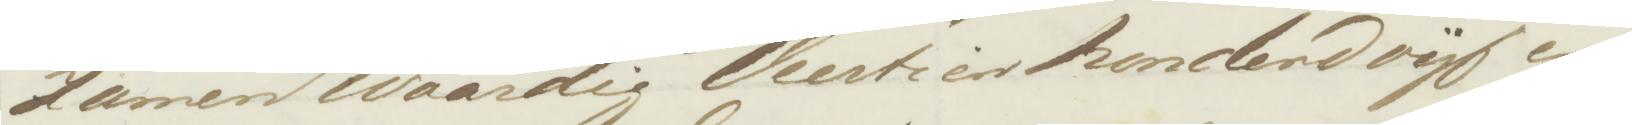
zamen waardig Veertien honderd vijf en
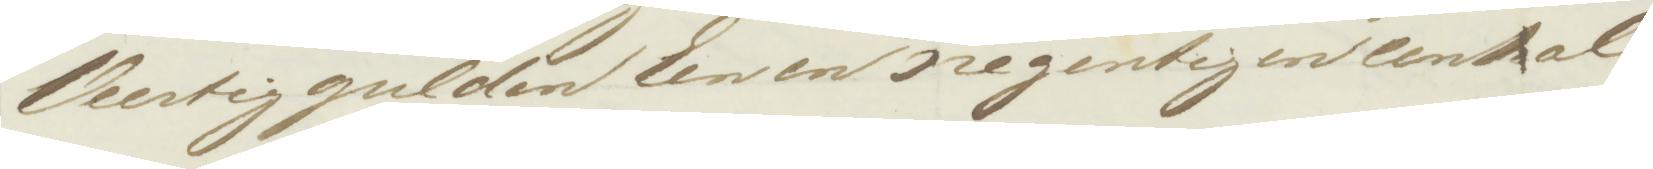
Veertig gulden Een en negentig en een hal
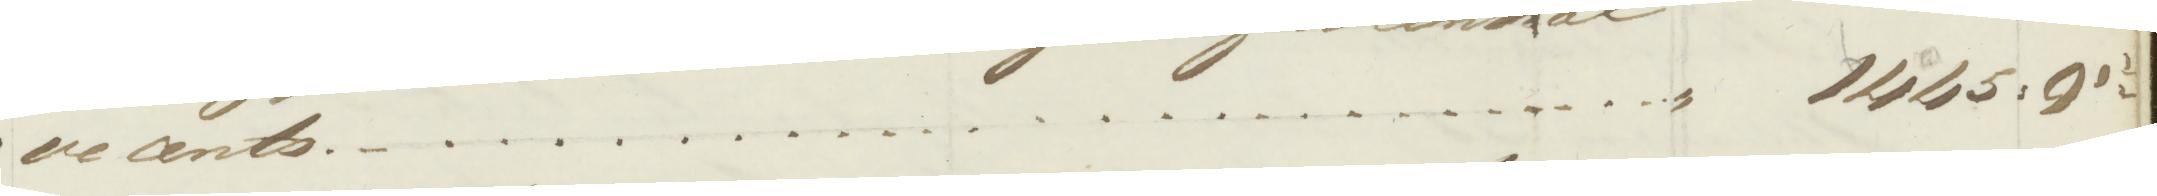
ve cents. - . . . . . . . . . . . . . . . . . . . . . . . . . . „ 1445: 91½
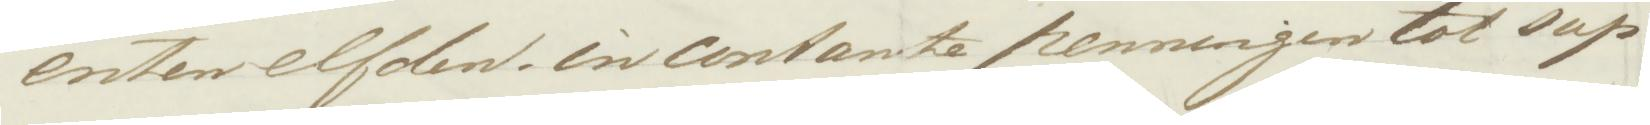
en ten elfden, in contante penningen tot sup
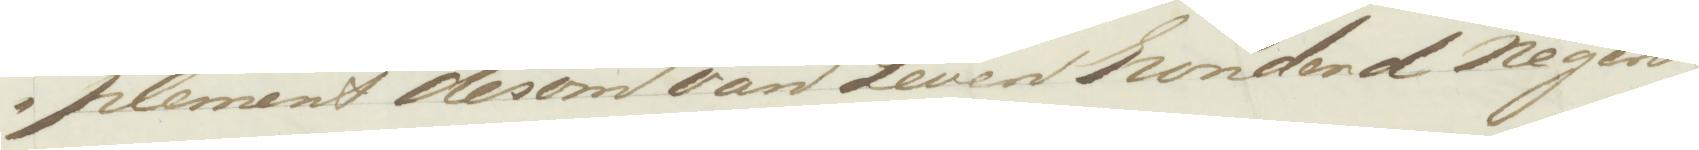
„plement de som van zeven honderd negen
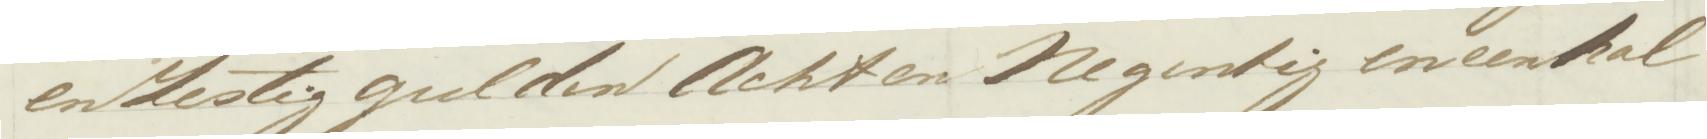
en zestig gulden Acht en Negentig en een hal
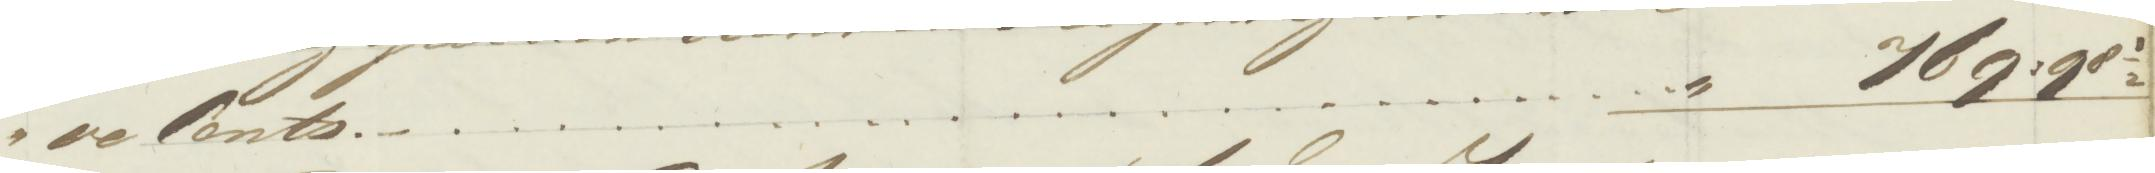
„ve Cents. - . . . . . . . . . . . . . . . . . . . . . . . . . . „ 769:98½
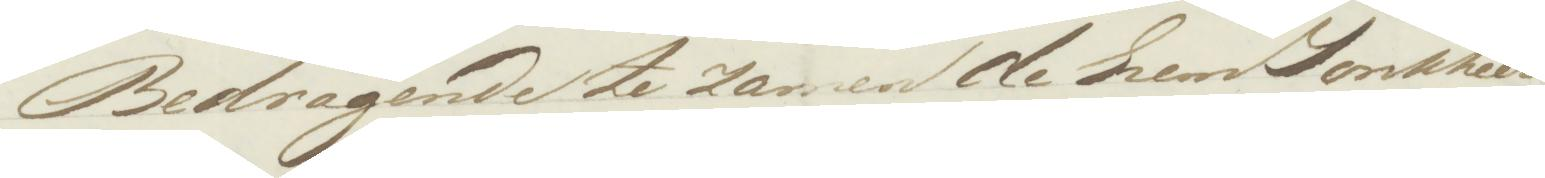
Bedragende te zamen de hem Ionkheer
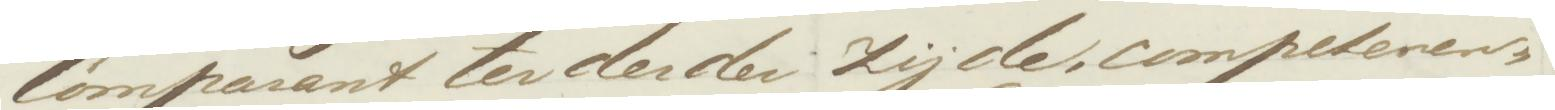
Comparant ter derder zijde, competeren„
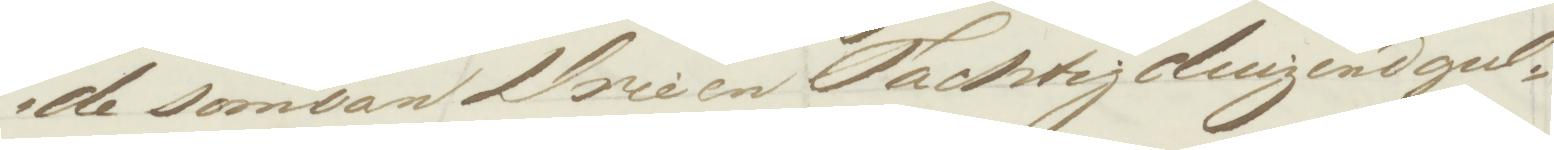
„de som van Drie en Tachtig duizend gul„
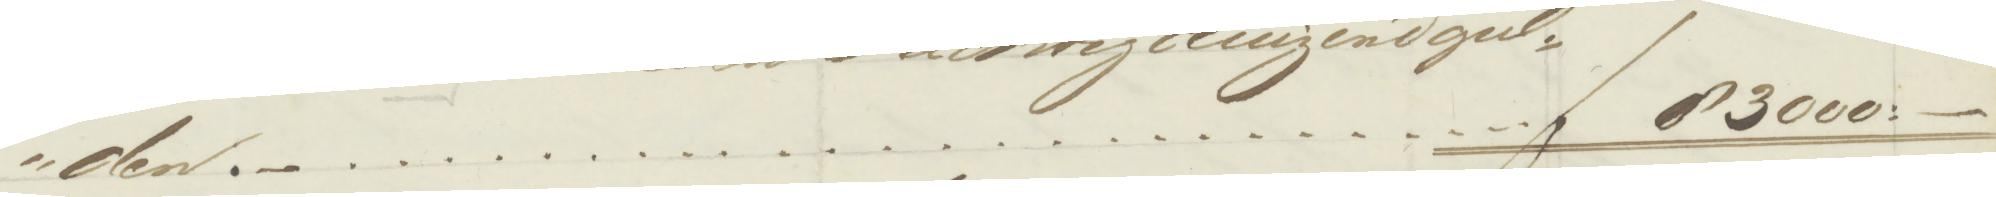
„den. - . . . . . . . . . . . . . . . . . . . . . . . . . ƒ 83000: —
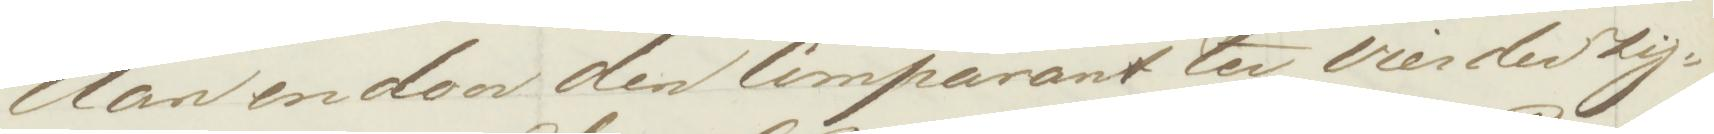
Aan en door den Comparant ter vierder zij„
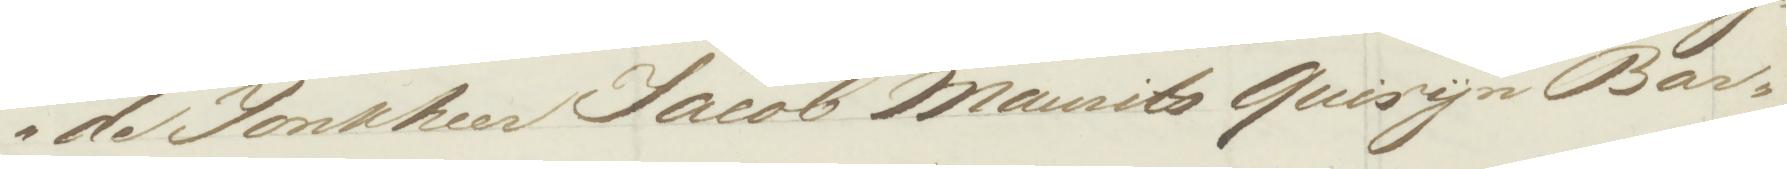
„de Ionkheer Iacob Maurits Quirijn Bar
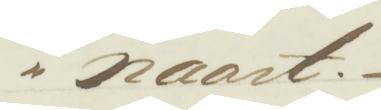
„naart.
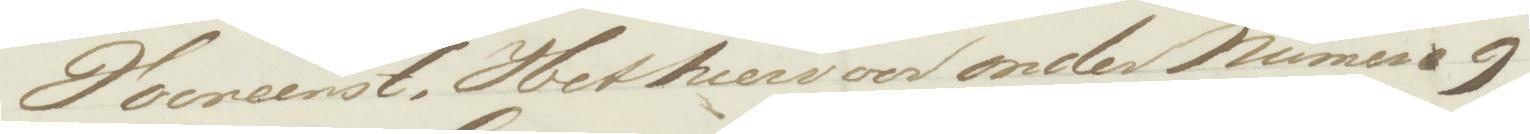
Voor eenst, Het hiervoor onder Numero 9
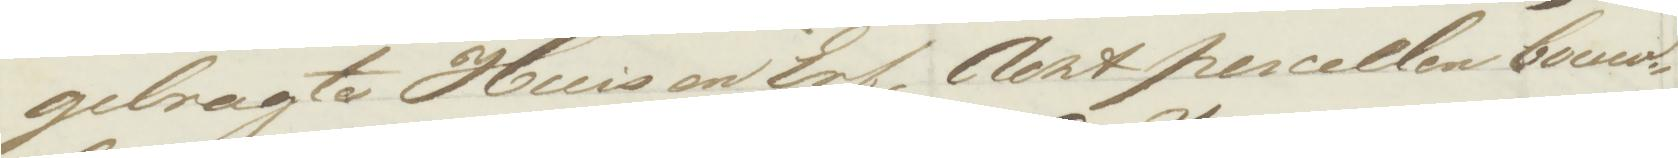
gebragte Huis en Erf, Acht perceelen bouw„
